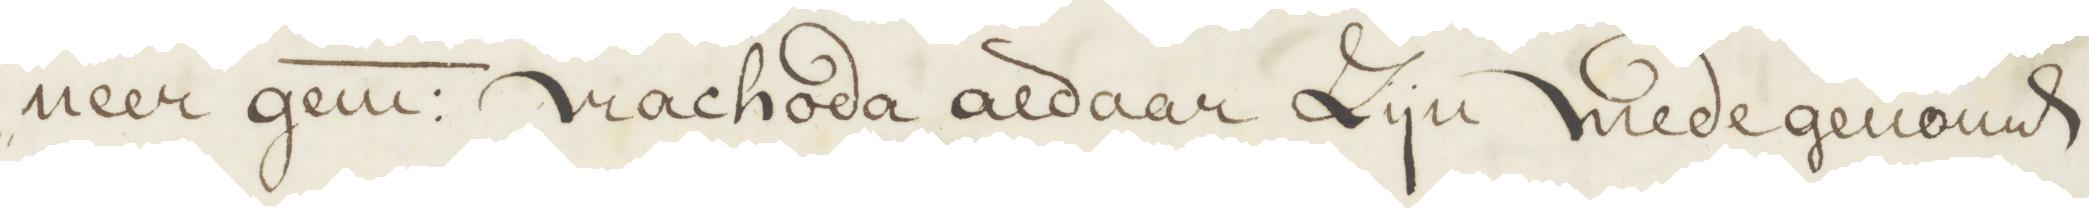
„neer gem: nachoda aldaar zijn mede genomen
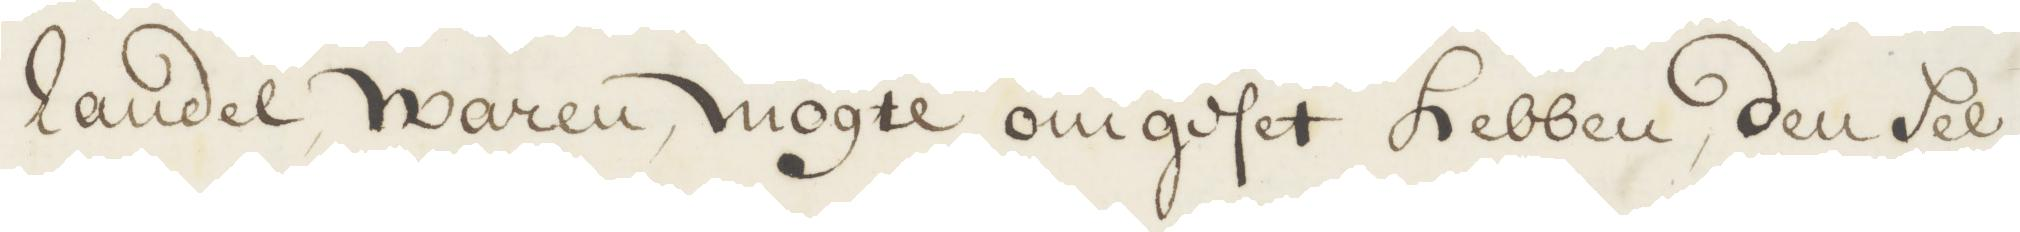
handel, waren, mogte omgeset hebben, den sel„
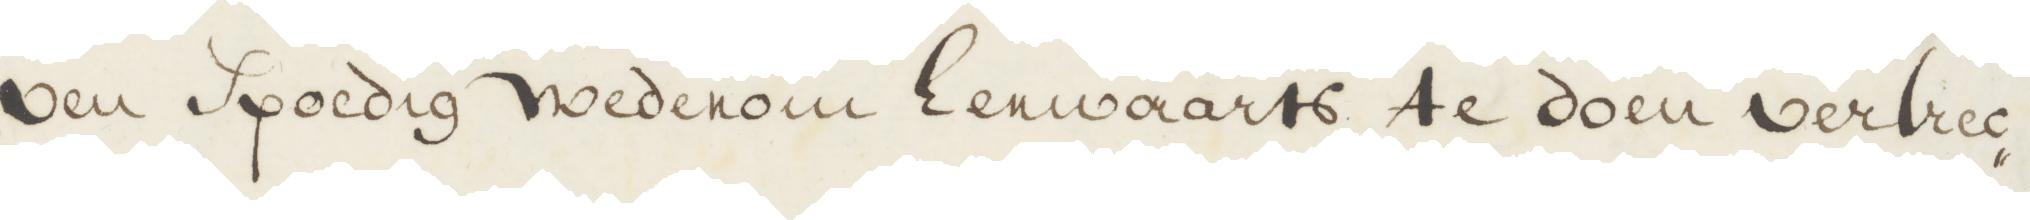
ven spoedig wederom herwaarts te doen vertrec„
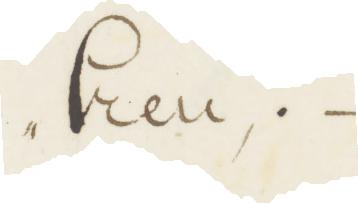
„ken,.—
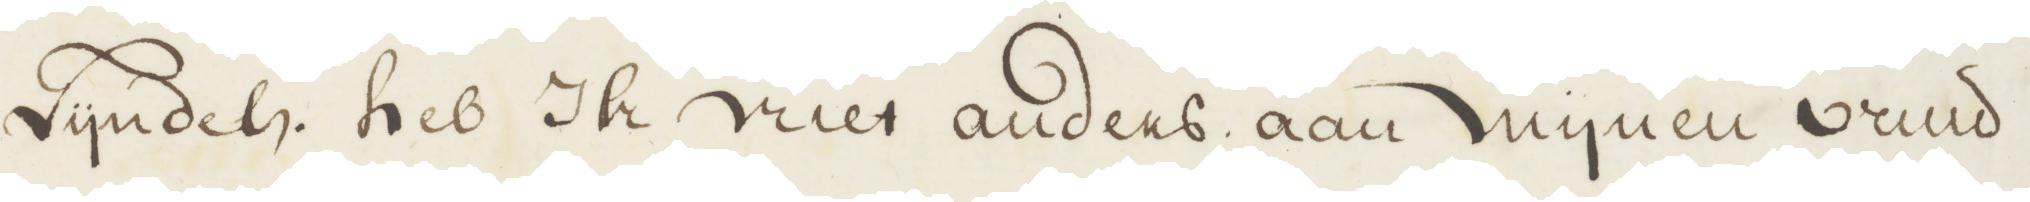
Eijndelijk heb Ik niet anders aan mijnen vrind
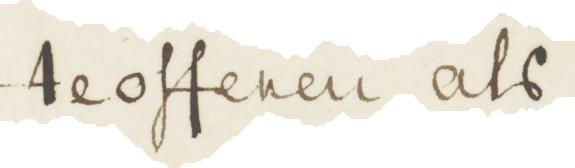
te offeren, als
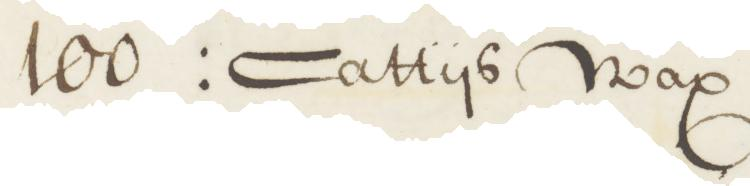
100: Cattijs wax
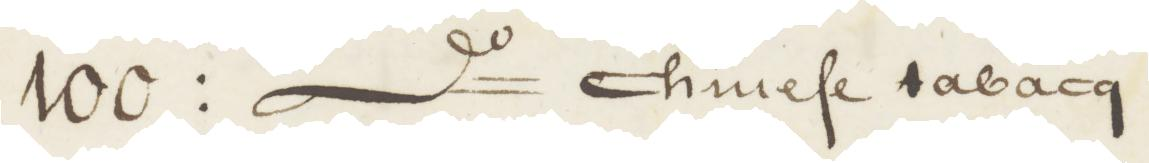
100: _=o chinese tabacq
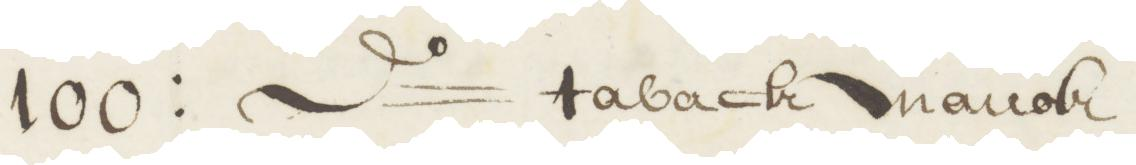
100: _=o taback manok
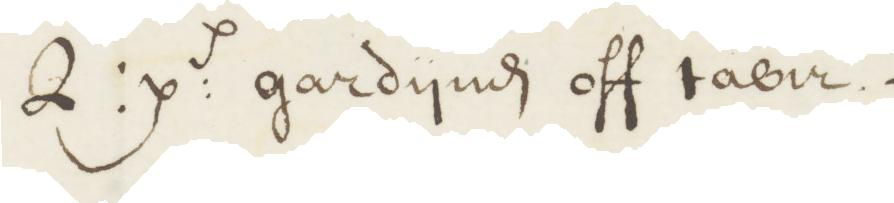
2: p:s gardijnen off tabir.
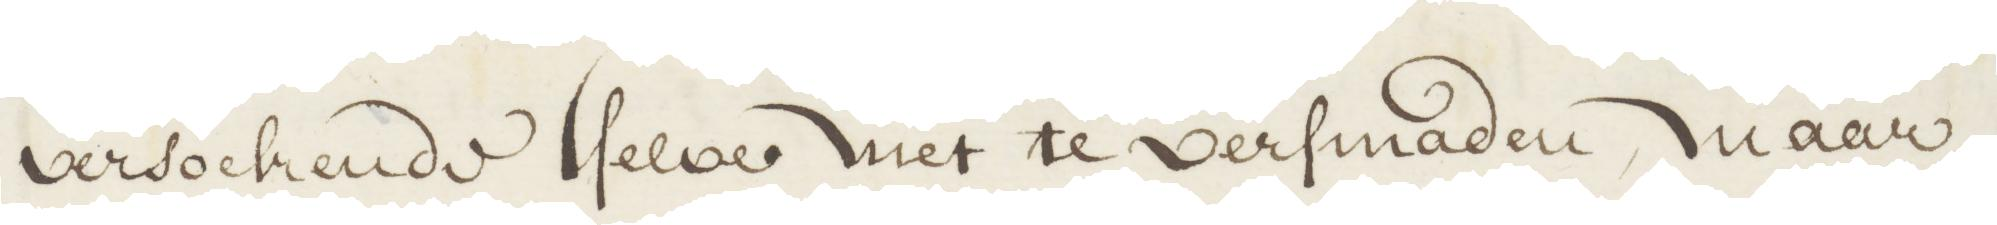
versoekende t selve niet te versmaden, maar
